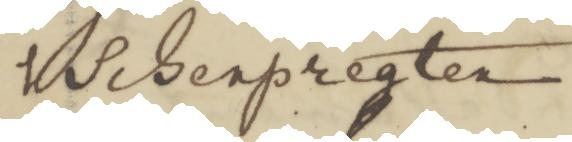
1 scherpregter
